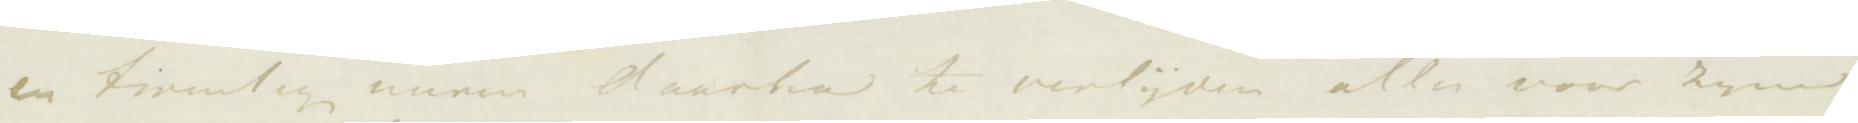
en twintig uuren daarna te verlijden alles voor zyne
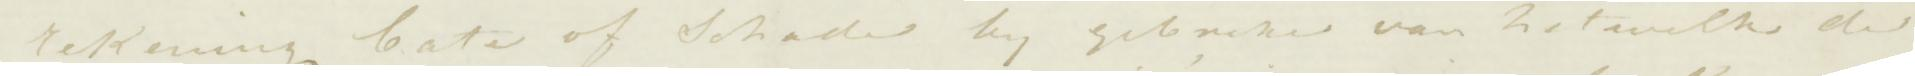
rekening bate of schade by gebreke van het welke de
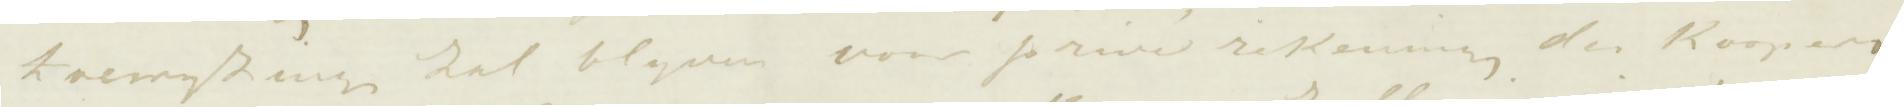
toewyzing Zal blyven voor privé rekening des Koopers
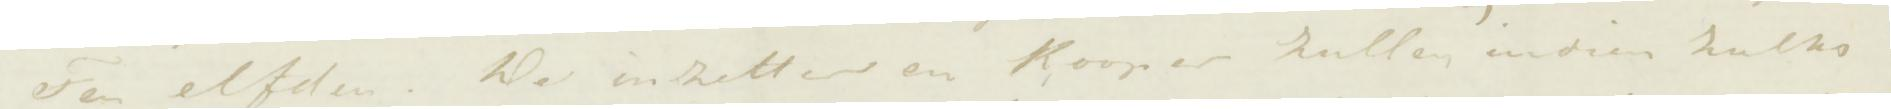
Ten elfden. De inzetter en kooper Zullen indien Zulks
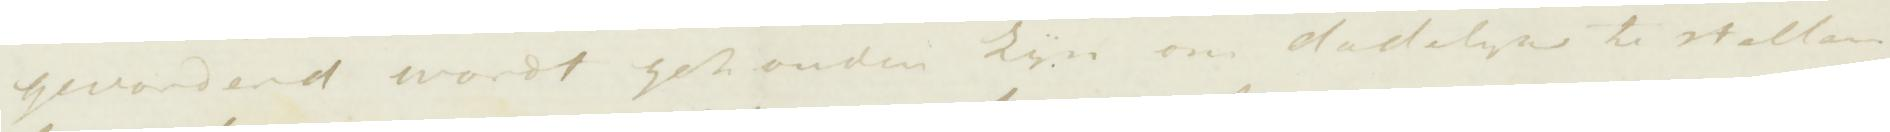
gevorderd wordt gehouden Zijn en dadelyk te stellen
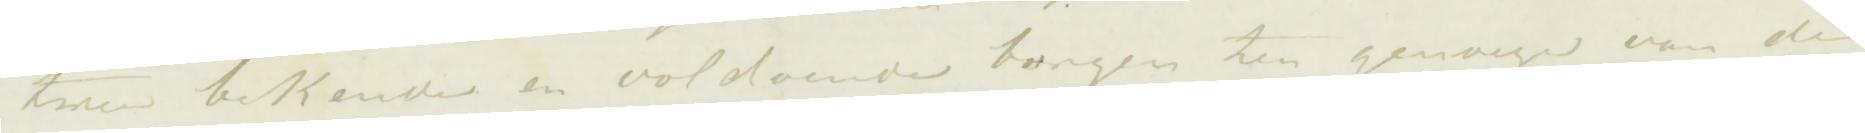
twee bekende en voldoende borgen ten genoege van de
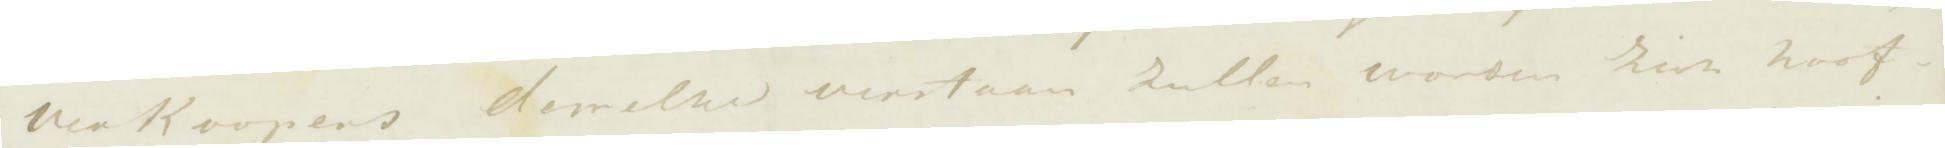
verkoopers dewelke verstaan zullen worden zich hoof=
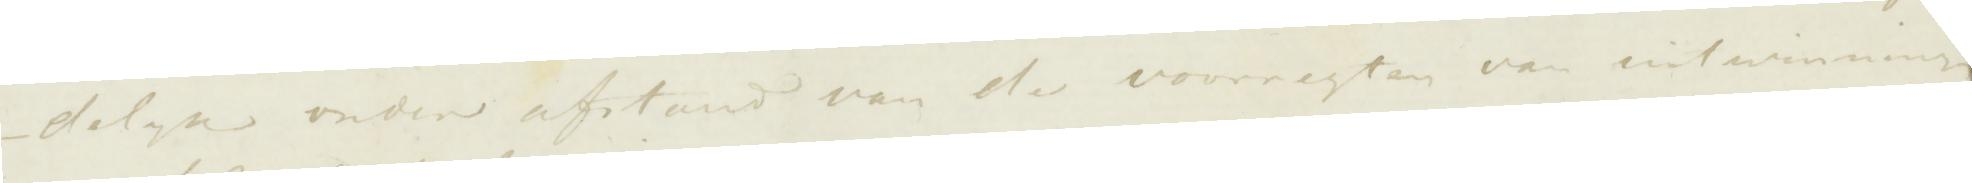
=delyk onder afstand van de voorregten van uitwinning
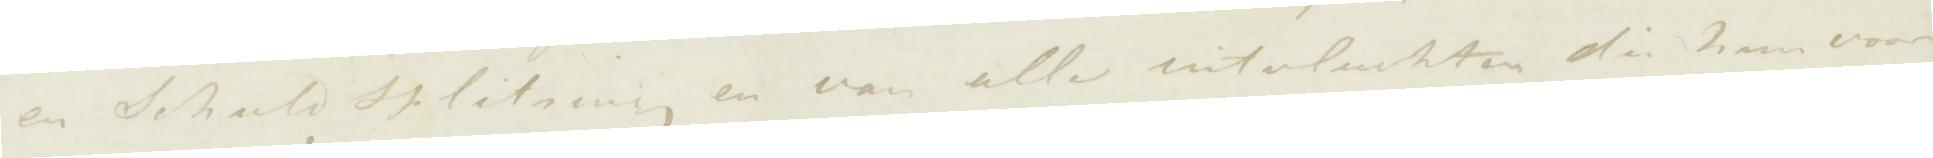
en schuldsplitsing en van alle uitvluchten die haar voor
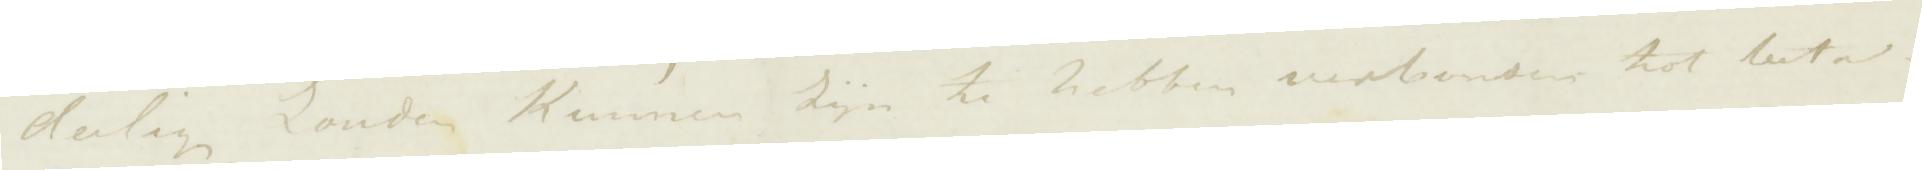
deelig Zouden Kunnen Zijn te hebben verbonden tot beta-
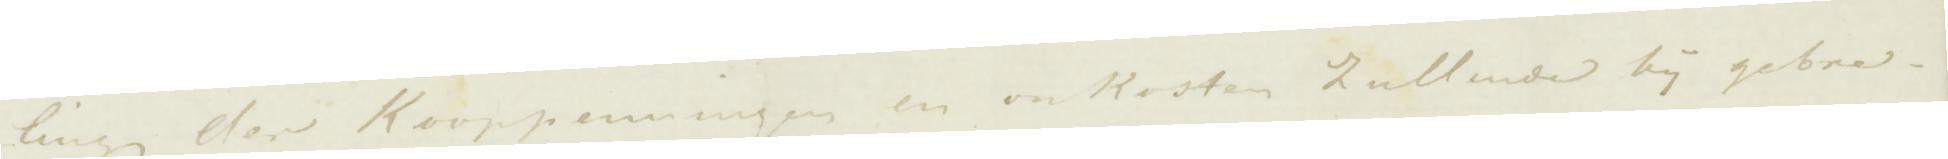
ling der Kooppenningen en onkosten Zullende bij gebre=
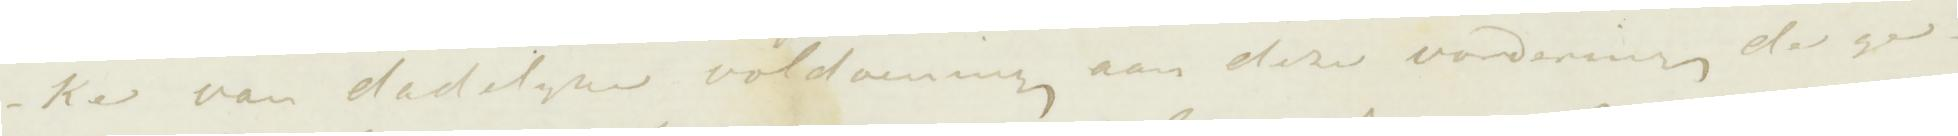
=ke van dadelyke voldoening aan deze vordering de ge
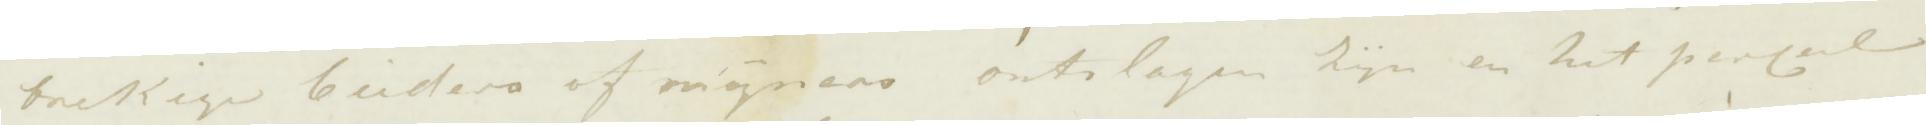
brekige beiders of mijners ontslagen zijn en het perceel
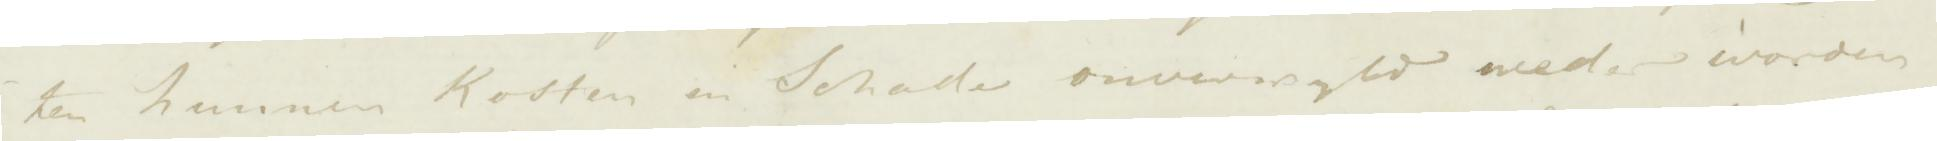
ten hunnen Kosten en Schade onverwyld weder worden
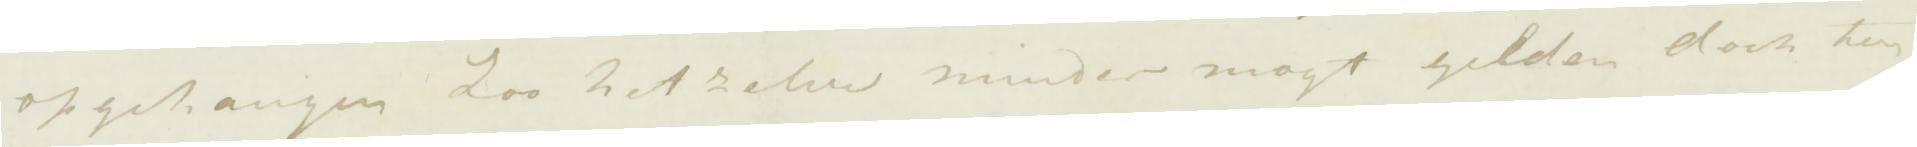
op gehangen Zoo het zelve minder mogt gelden doch ten
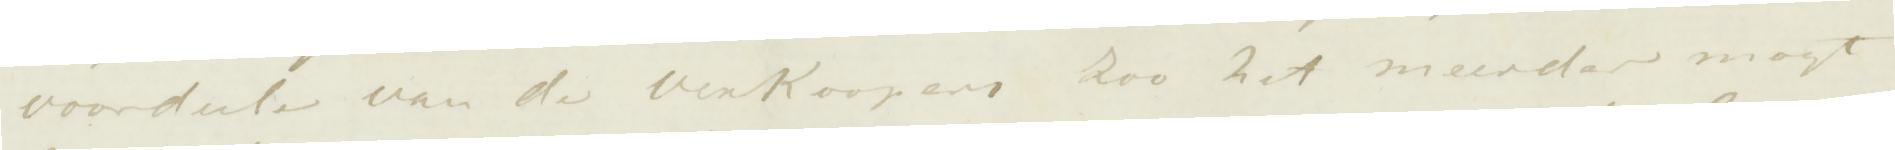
voordeele van de verkoopens zoo het meerder mogt
